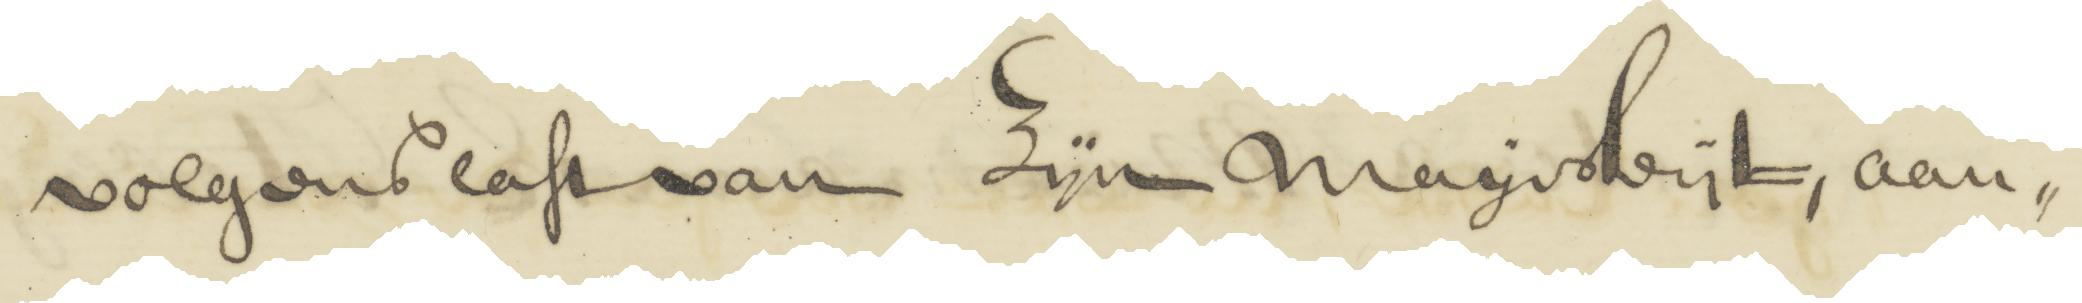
volgens last van Zijn maijesteijt, aan„
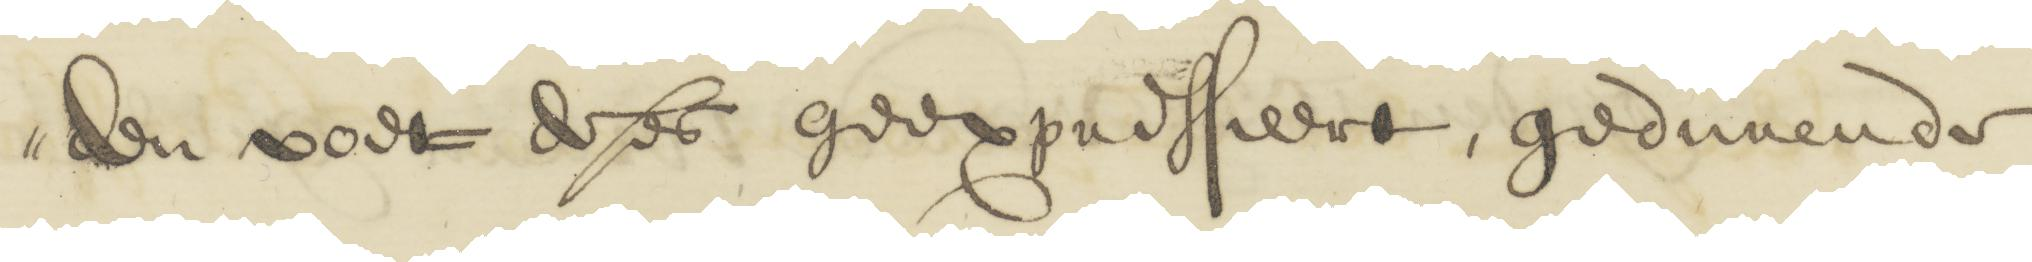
„den voet deses geexpresseert, gedurende
